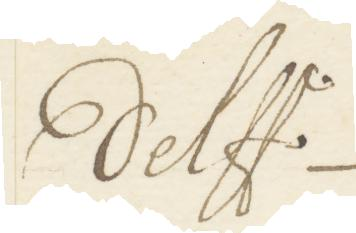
delff
